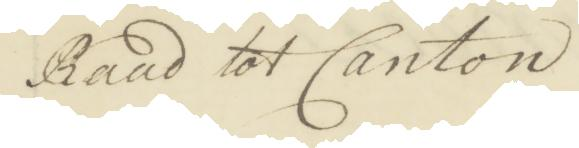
Raad tot Canton
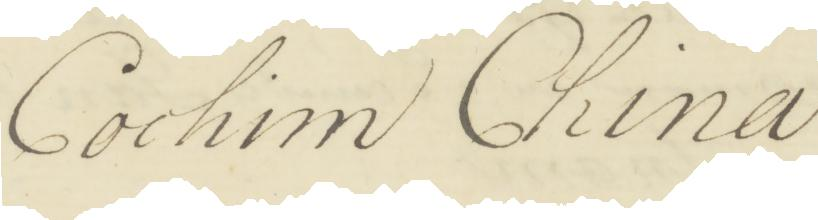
Cochim China
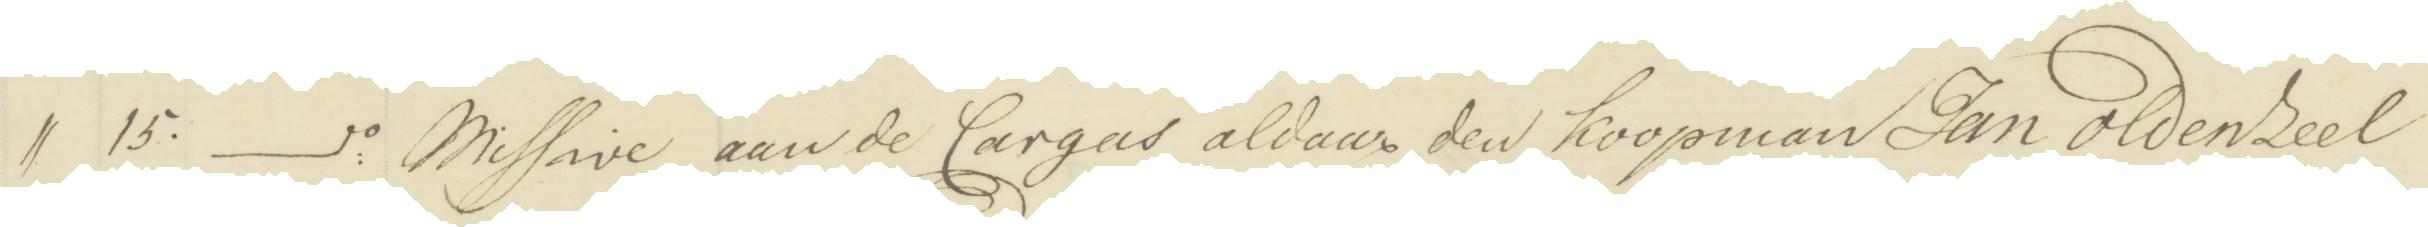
„ 15: _:o Missive aan de Cargas aldaar den koopman Jan oldenzeel
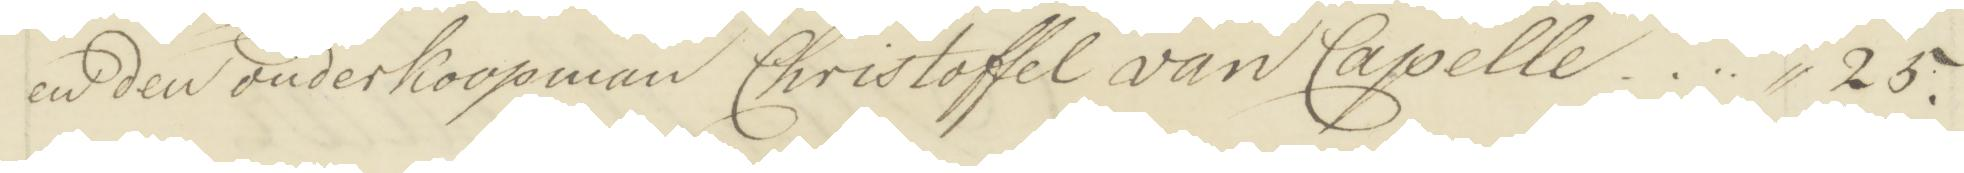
en den onderkoopman Christoffel van Capelle . . . „ 25.
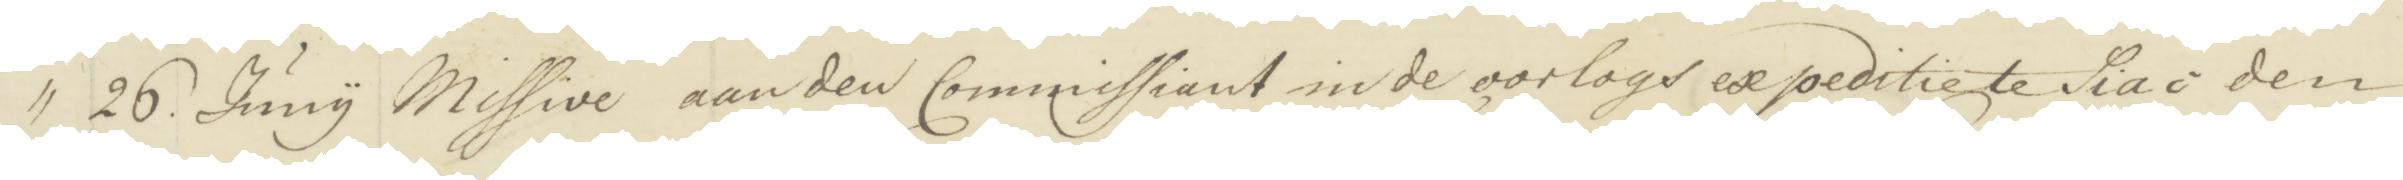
„ 26 Junij Missive aan den Commissiant in de oorlogs expeditie te Siac den
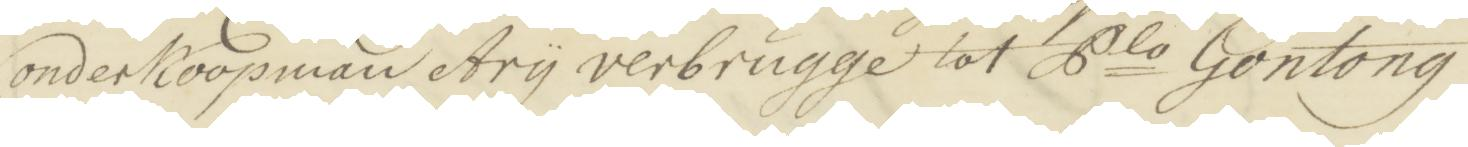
onderKoopman Arij verbrugge tot P=lo Gontong
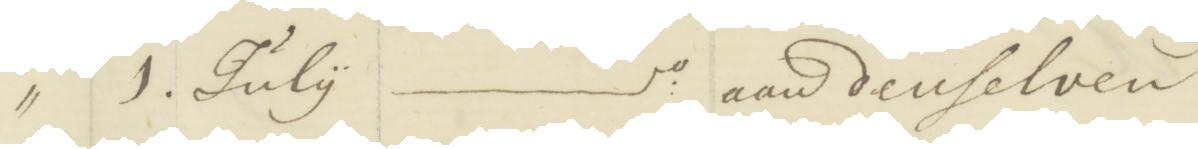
„ 1. Julij _:o aan denselven
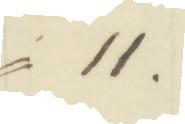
„ 11.
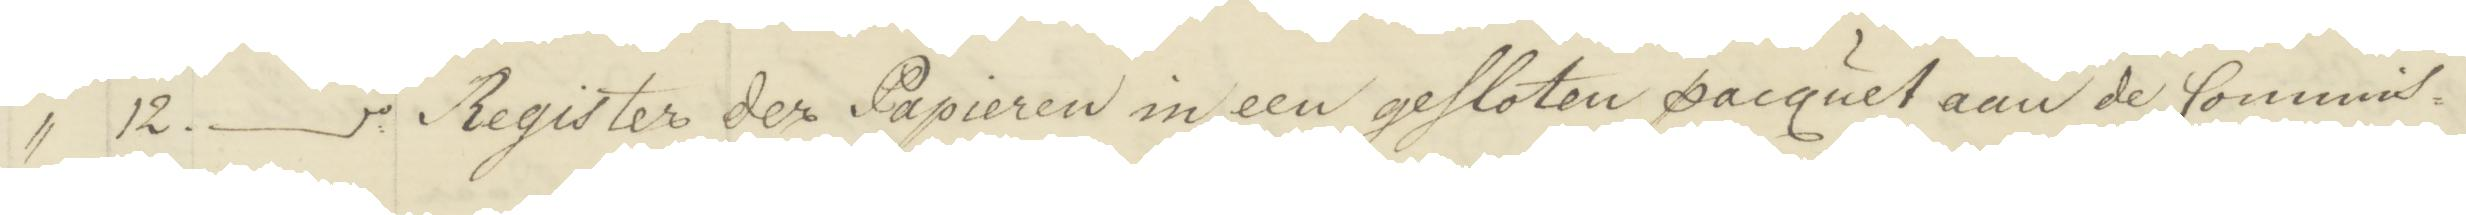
„ 12. _:o Register der Papieren in een gesloten pacquet aan de Commis=
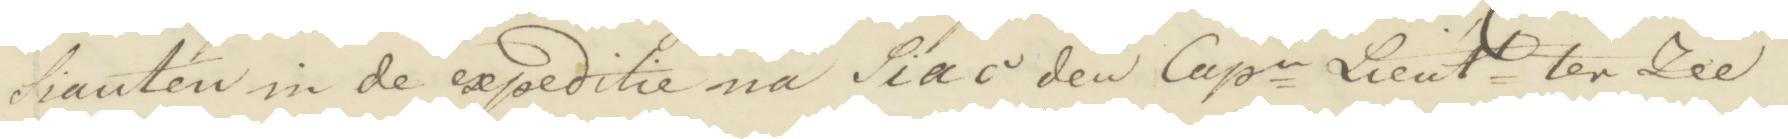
sianten in de expeditie na Siac den Cap=n Lieut=t ter zee
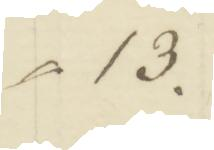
„ 13.
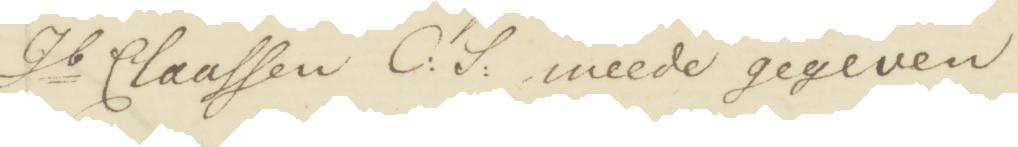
J:b Claassen C:S: meede gegeven
